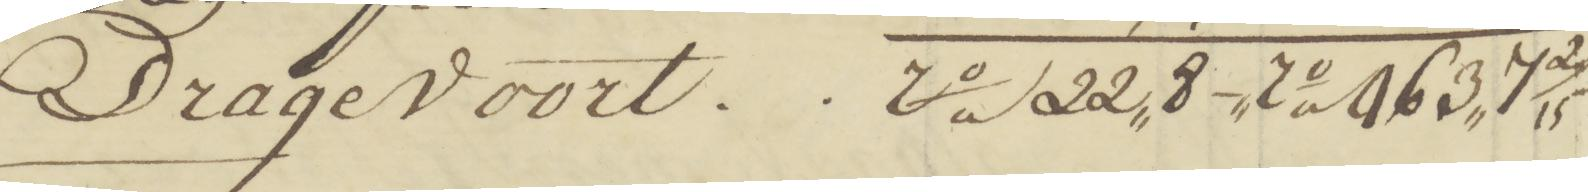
Dragevoort. .R:o/a 22„ 8 - R o/a 463„ 7 2/15
